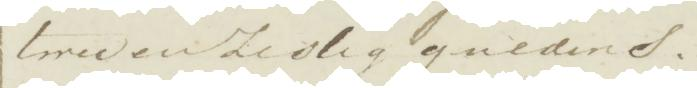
twee en Zestig guldens.
